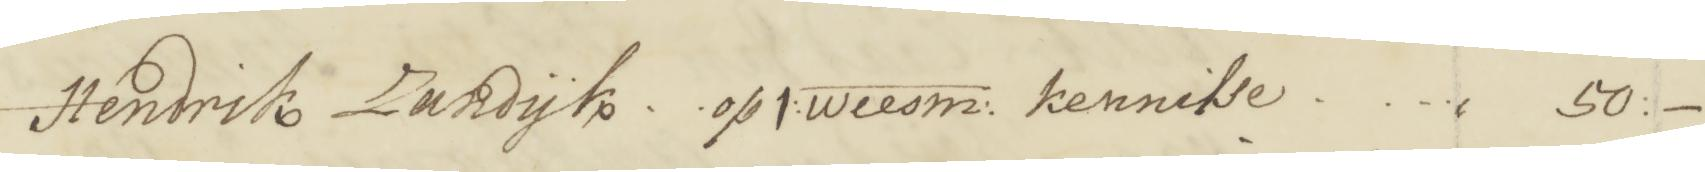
Hendrik zandijk . . op 1: weesm: kennisse . . . . „ 50: —
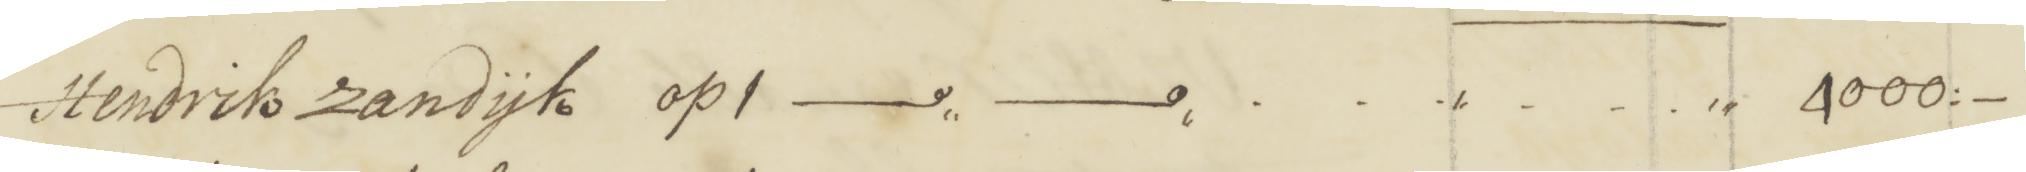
Hendrik zandijk op 1 _„o _„o . . . „ . . . „ 4000: —
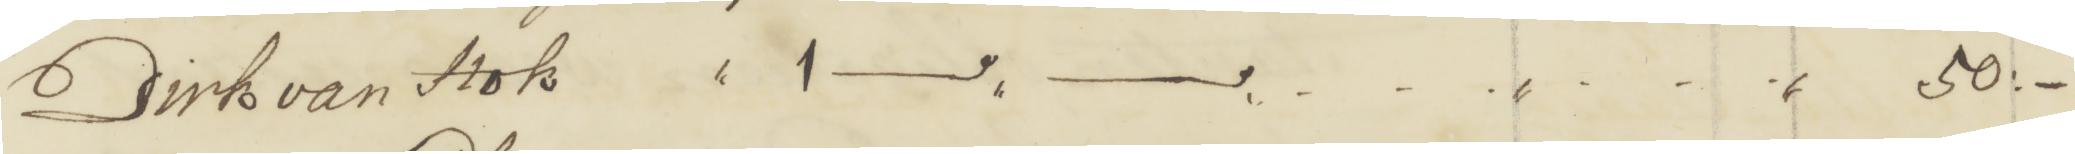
Dirk van stok „ 1 _„o _„o . . . „ . . . „ 50: —
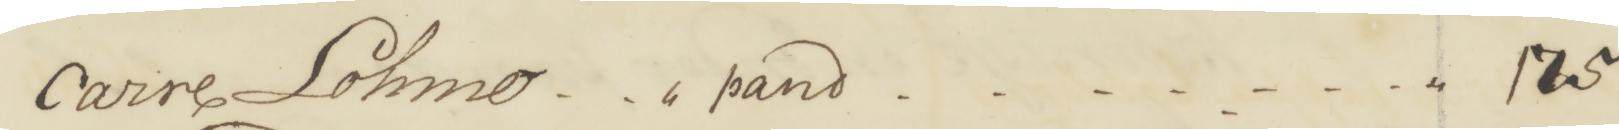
carre Lohmo „ pand „ 175
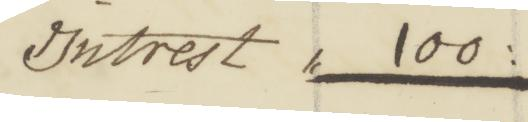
Intrest „ 100:
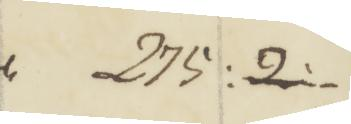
„ 275: 2: —
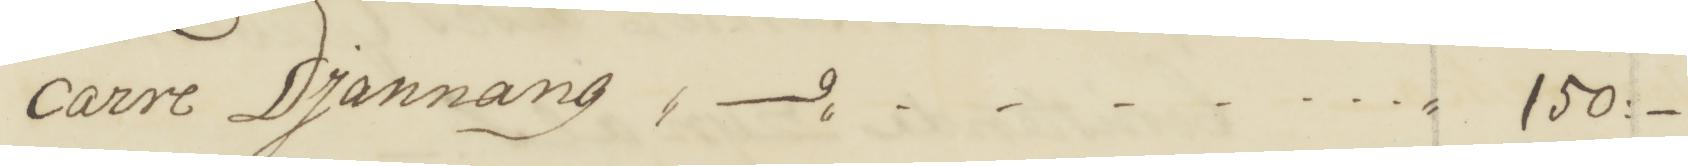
carre Djannang „ _„o . . . . . . . „ 150: —
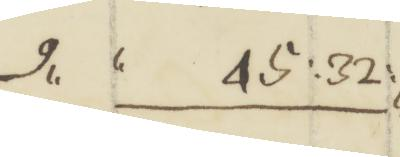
d„o „ 45: 32:
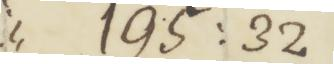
„ 195: 32
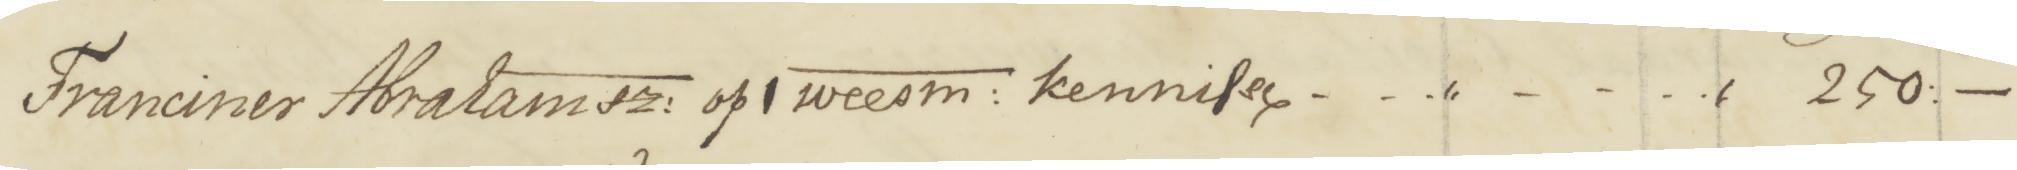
Franciner Abrahamsz: op 1 weesm: kennisse . . . „ . . . . „ 250: —
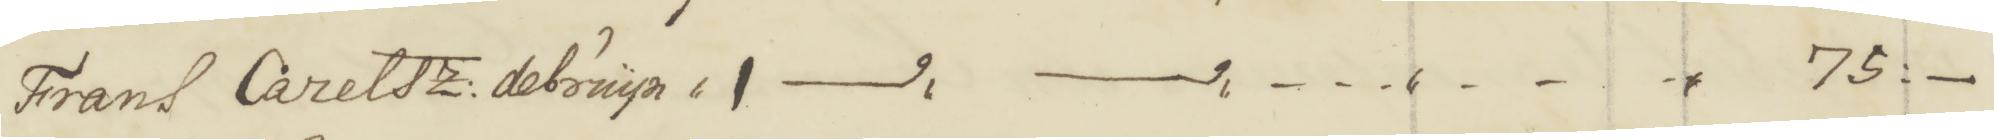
Frans Carelsz: debruijn „ 1 _„o _„o . . . „ . . . „ 75: —
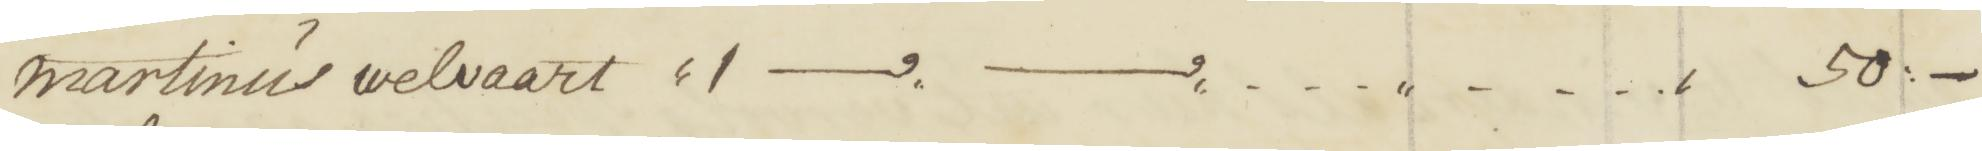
martinus welvaart „ 1 _„o _„o . . . „ . . . . „ 50: —
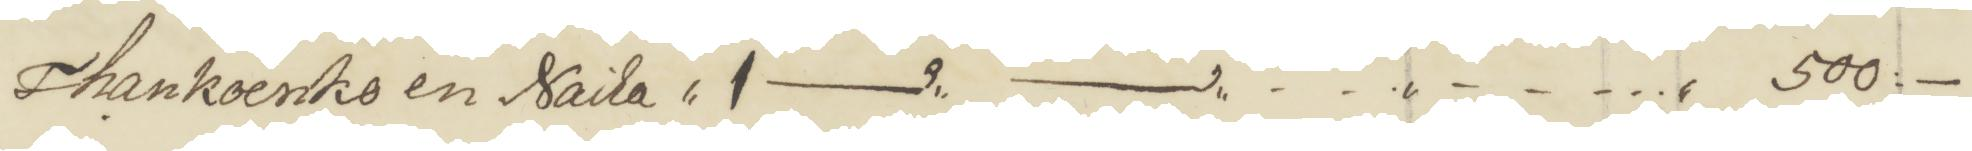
Thankoenko en Naiha „ 1 _„o _„o . . . „ . . . . . „ 500: —
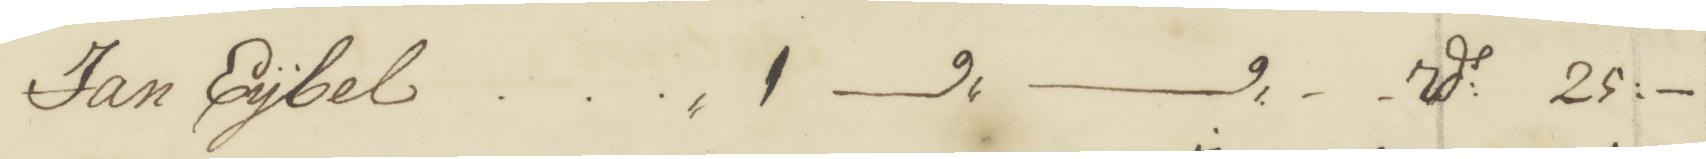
Jan Eijbel . . . „ 1 _„o _„o . . rd:s 25: —
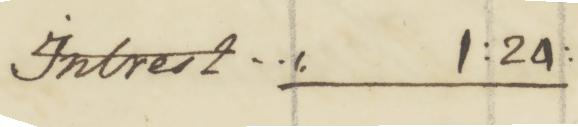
Intrest . . „ 1: 24:
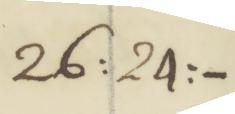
26: 24: —
